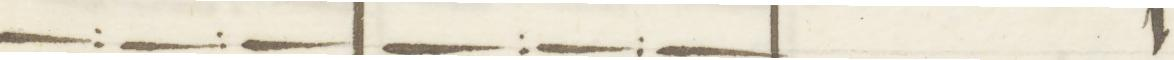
—:—:— —:—:— 1
